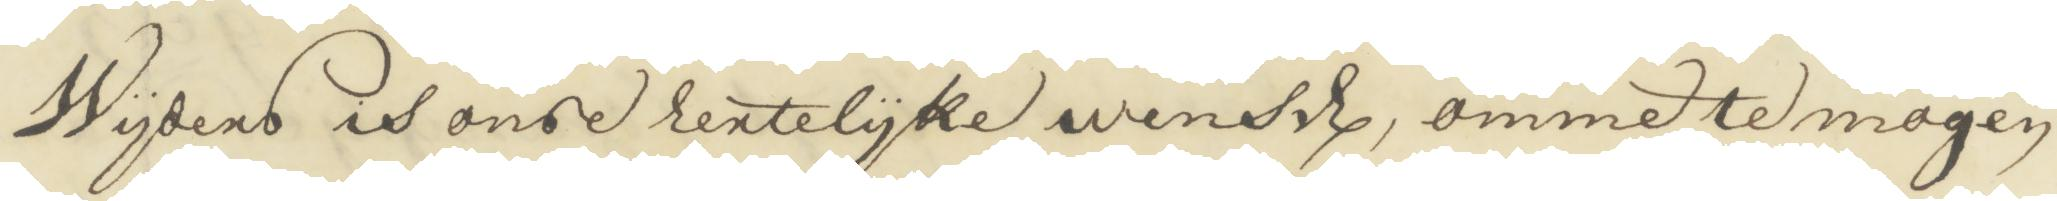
Wijders is onse hertelijke wensch, omme te mogen
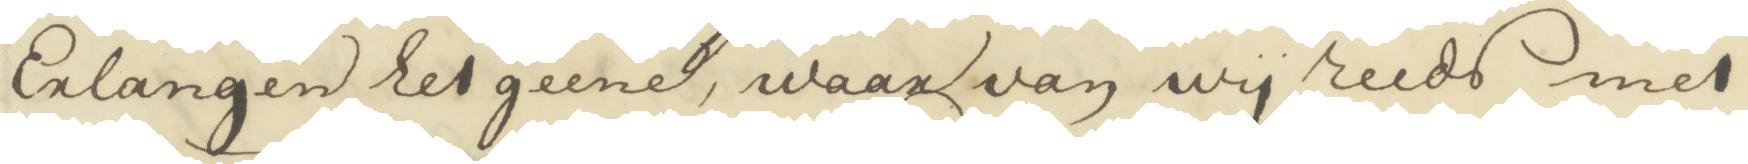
Erlangen het geene, waar van wij reeds met
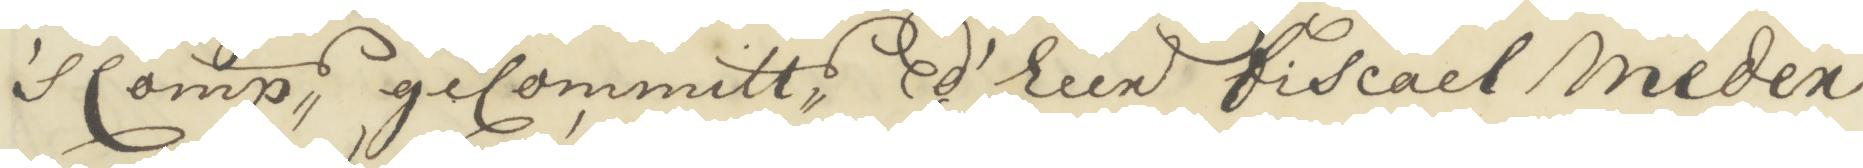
’s Comp„s gecommitt„s Ed’ heer fiscael meder
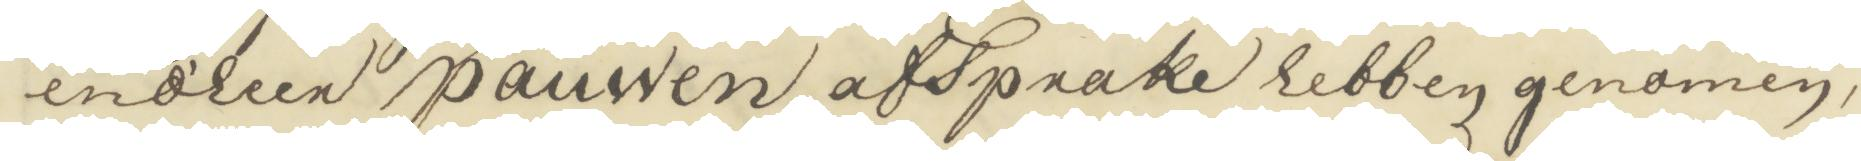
end'heer pauwen afsprake hebben genomen
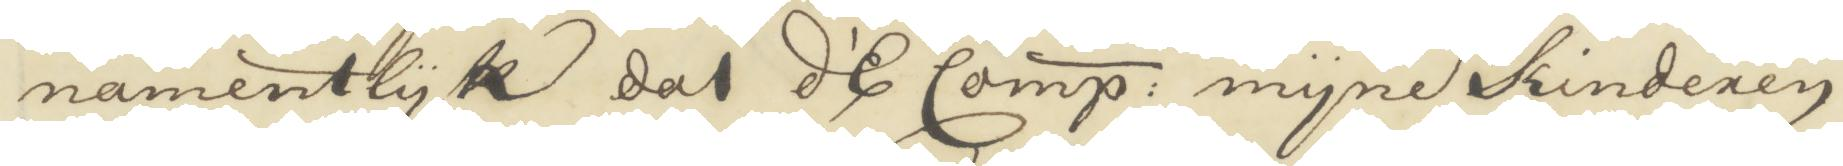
namentlijk dat d'E Comp: mijne kinderen
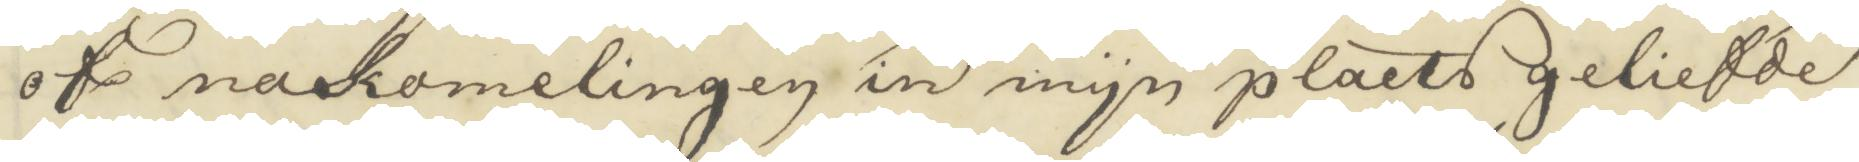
of nakomelingen in mijn plaets geliefde
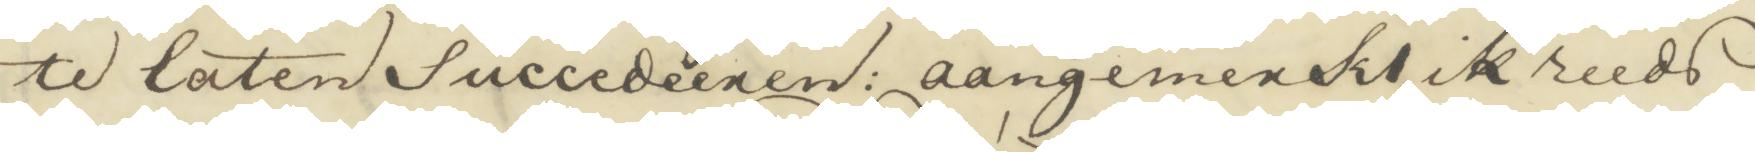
te laten succedeeren: aangemerkt ik reeds
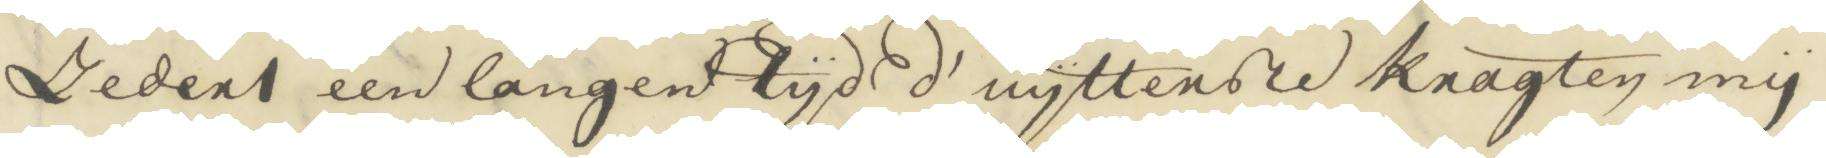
zedert een langen tijd d’ uijtterste kragten mij
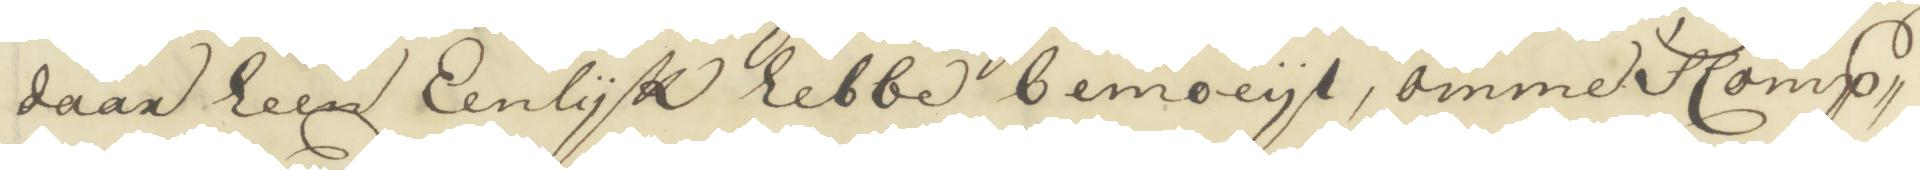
daar heen Eenlijk hebbe bemoeijt, omme ’sComp„s
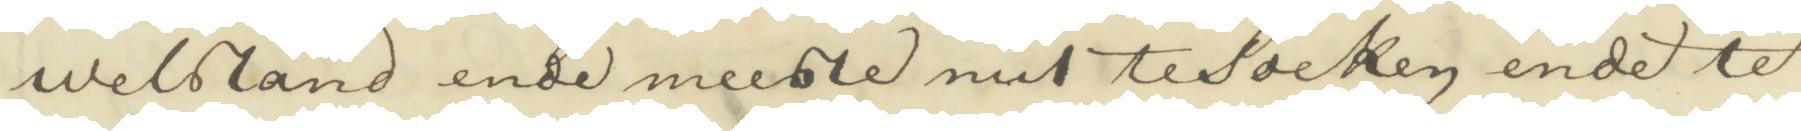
welstand ende meeste nut tesoeken ende te
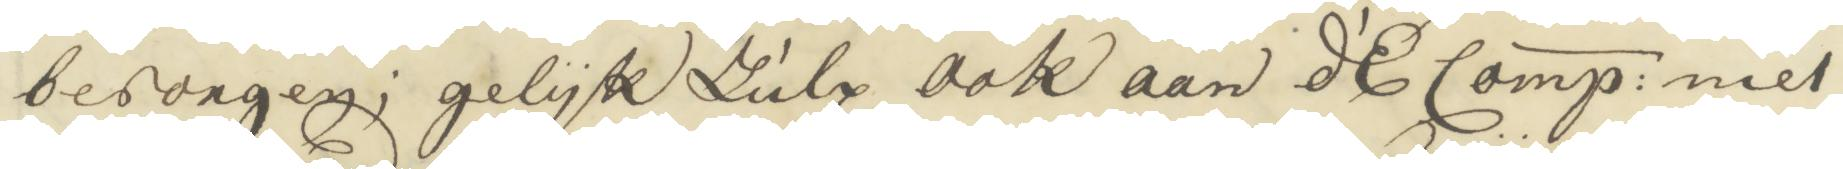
besorgen; gelijk zulx ook aan d'E Comp: niet
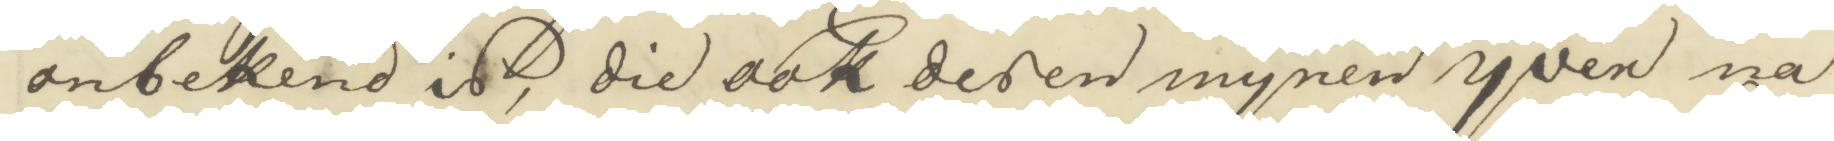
onbekend is, die ook des en mijnen ijver na
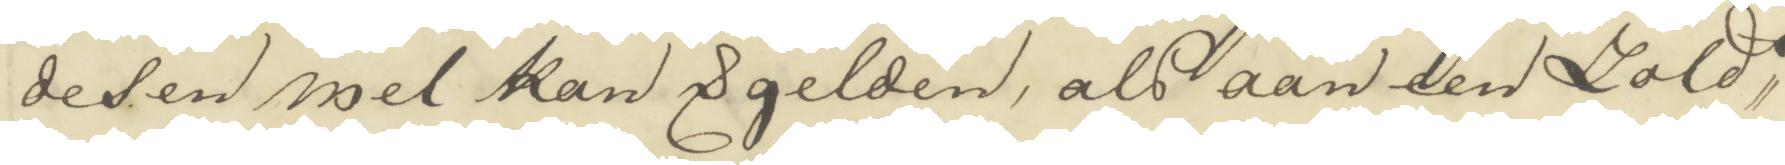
desen wel kan vergelden, als aan een zold„t
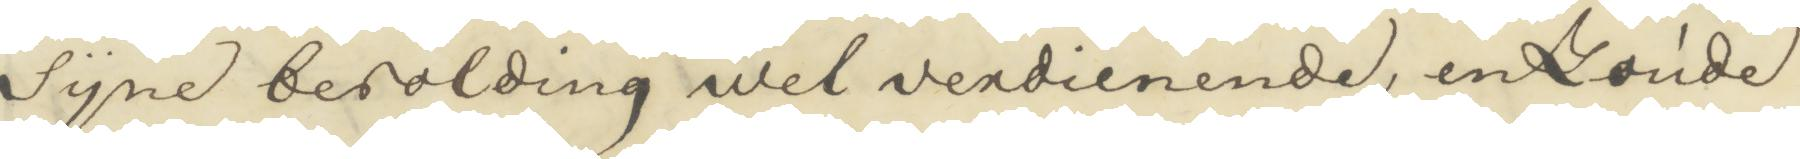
sijne besolding wel verdienende, en zoude
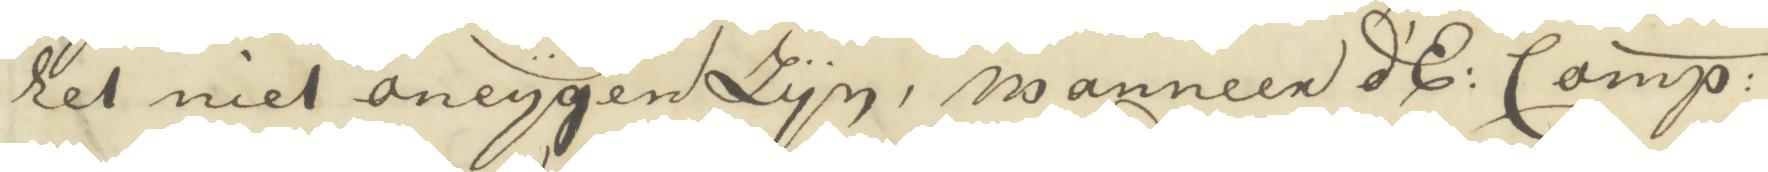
het niet oneijgen zijn, wanneer d'E: Comp:
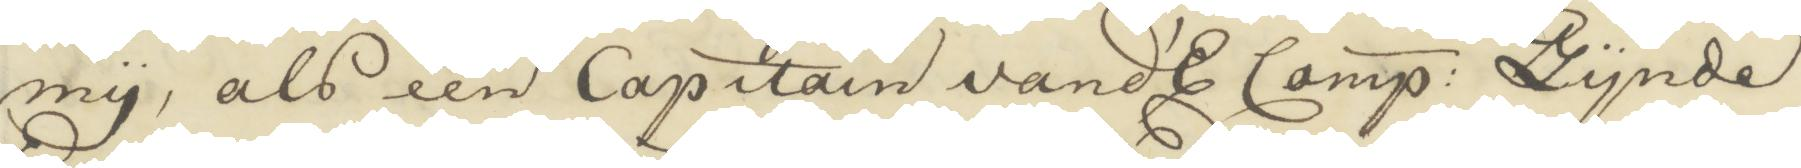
mij, als een Capitain van d'E Comp: zijnde
